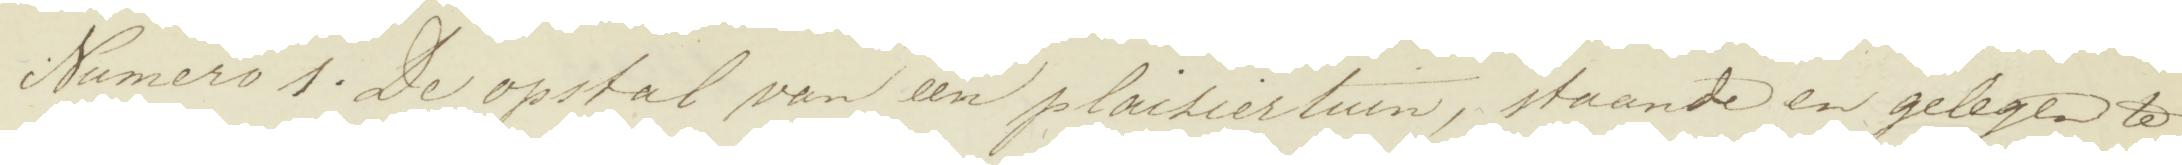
Numero 1. De opstal van een plaiziertuin, staande en gelegen te
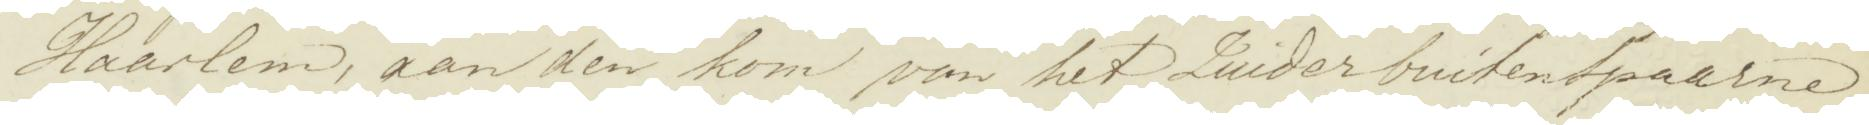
Haarlem, aan den kom van het Zuiderbuitenspaarne,
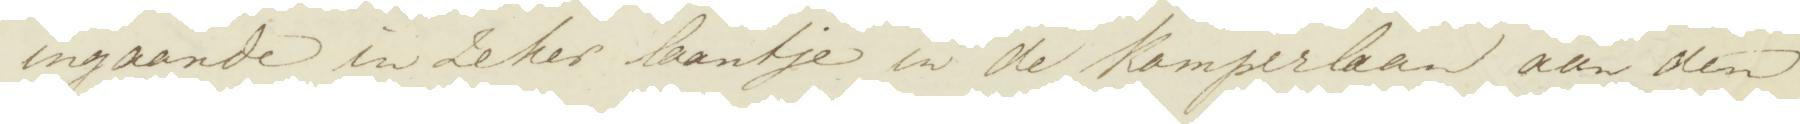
ingaande in zeker laantje in de Kamperlaan aan den
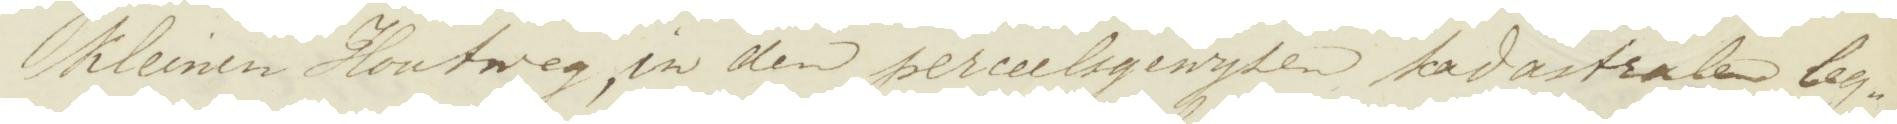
Kleinen Houtweg, in den perceelsgewyzen kadastralen leg„
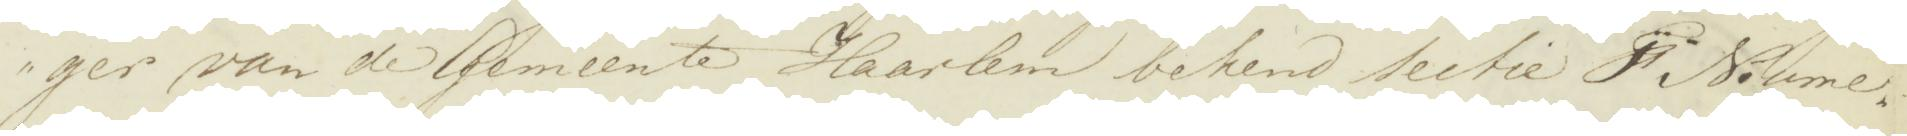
„ger van de Gemeente Haarlem bekend sectie F Nume„
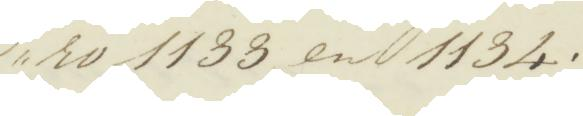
„ro 1133 en 1134
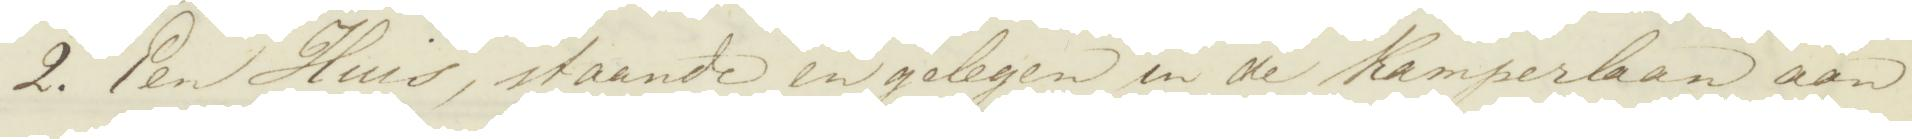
2. Een Huis, staande en gelegen in de Kamperlaan aan
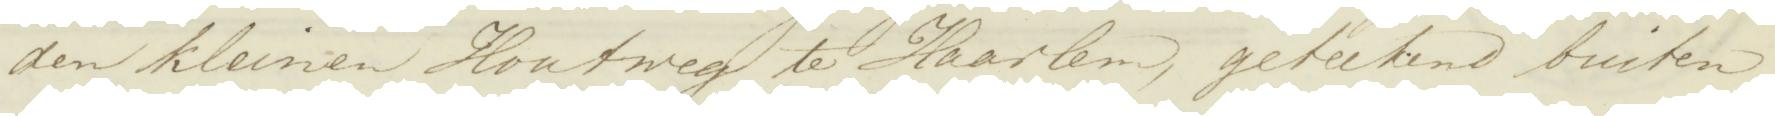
den kleinen Houtweg te Haarlem, geteekend buiten
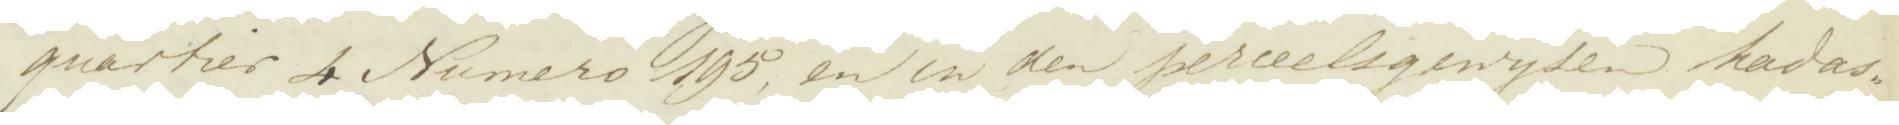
quartier 4 Numero 195, en in den perceelsgewyzen kadas„
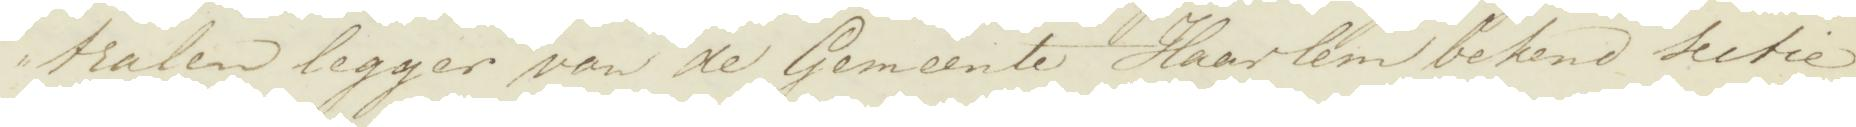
„tralen legger van de Gemeente Haarlem bekend sectie
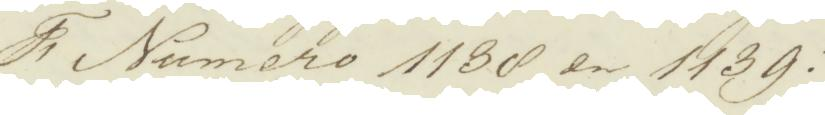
F Numero 1138 en 1739
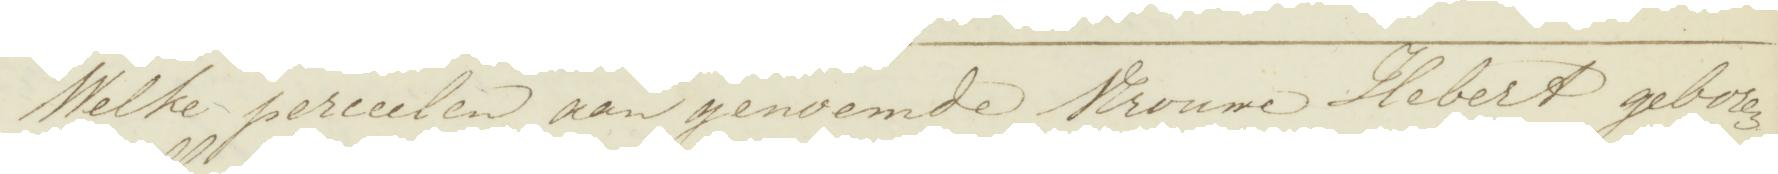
Welke perceelen aan genoemde vrouwe Hebert geboren
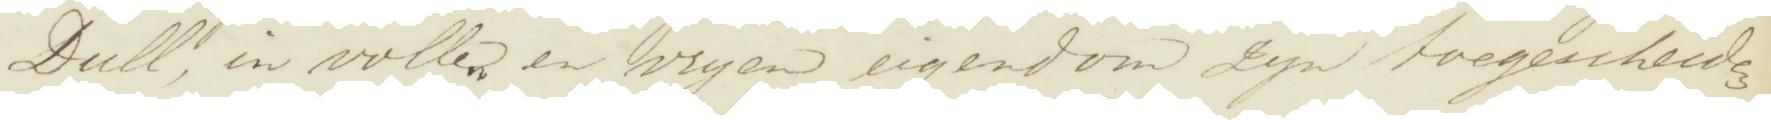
Dull, in vollen en vryen eigendom zyn toegescheiden
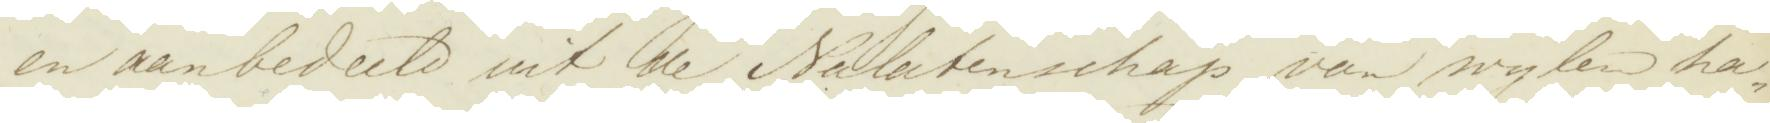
en aan bedeeld uit de Nalatenschap van wylen ha
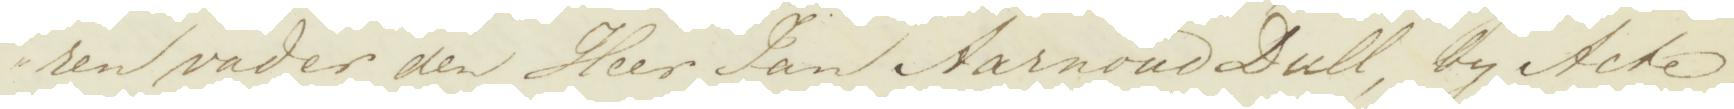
„ren vader den Heer Jan Aarnoud Dull, by Acte
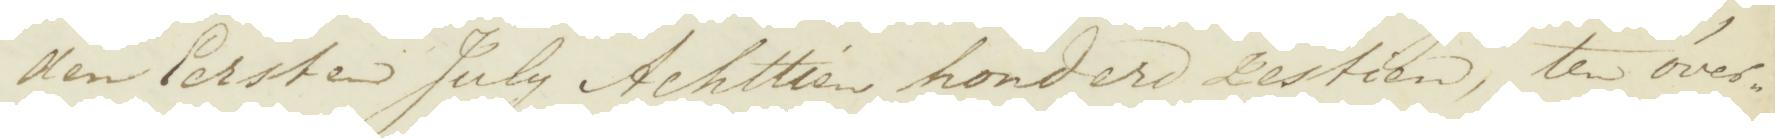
den Eersten July Achttien honderd zestien, ten over„
